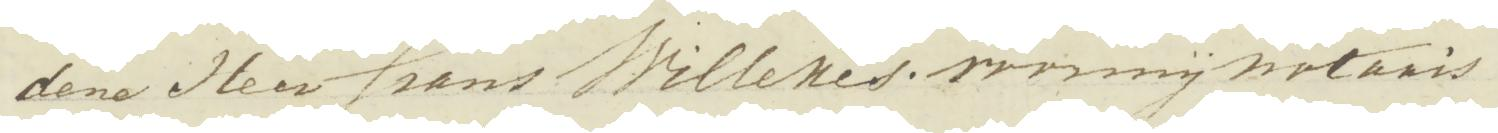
dene Heer Frans Willekes, voor mij notaris
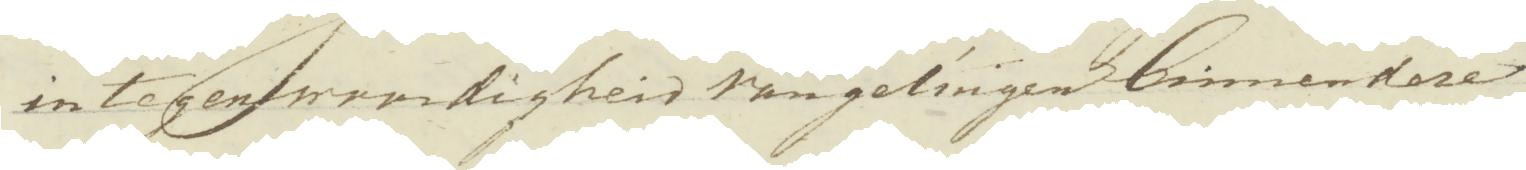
in tegenwoordigheid van getuigen binnen deze
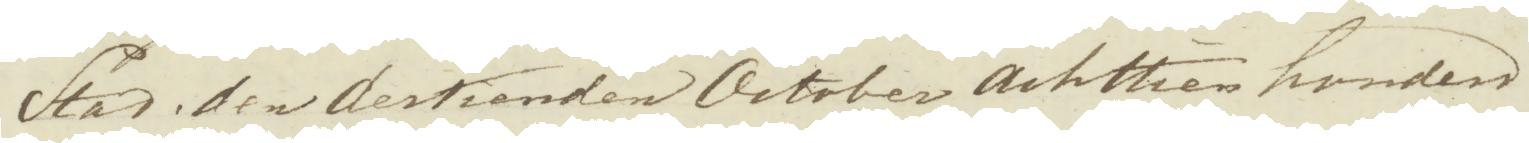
stad, den dertienden October achttien honderd
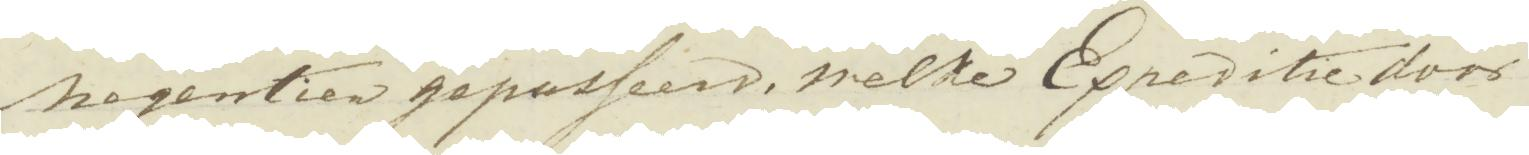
negentien gepasseerd, welke Expeditie door
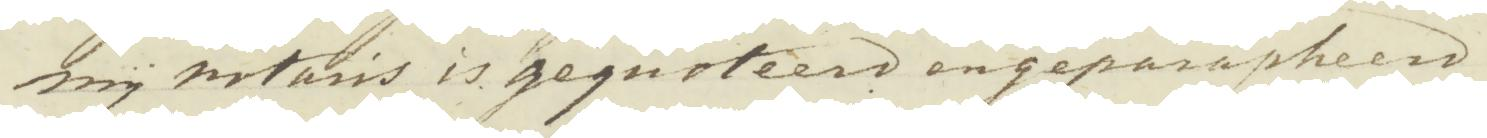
mij notaris is gequoteerd en geparapheerd
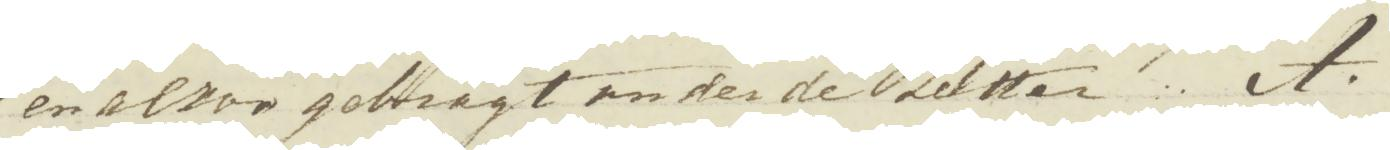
en alzoo gebragt onder de Letter A.
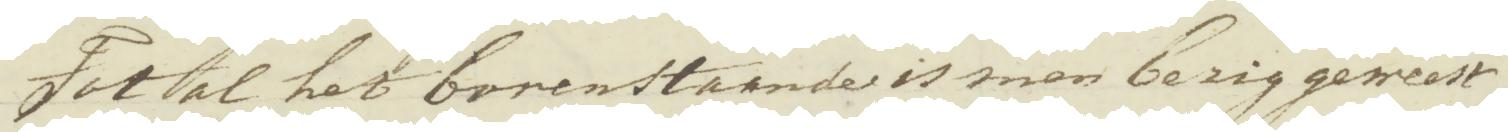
Tot al het bovenstaande is men bezig geweest
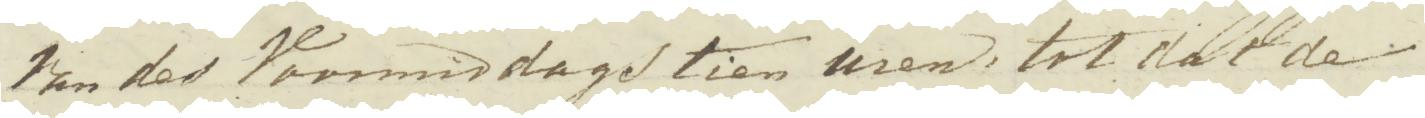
van des Voormiddags tien uren, tot dat de
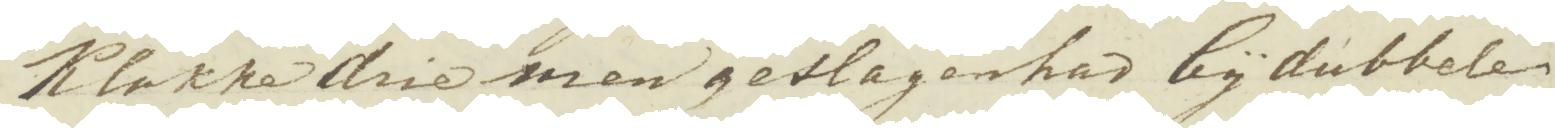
Klokke drie uren geslagen had bij dubbele
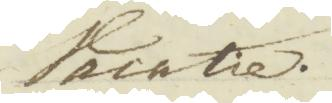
Vacatie.
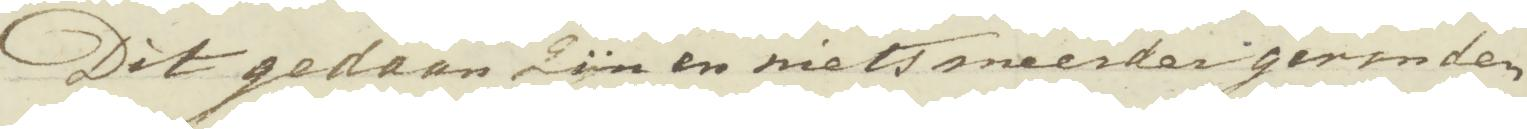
Dit gedaan zijn en niets meerder gevonden
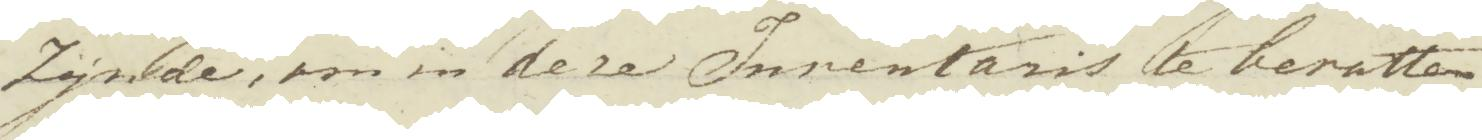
Zijnde, om in deze Inventaris te bevatten
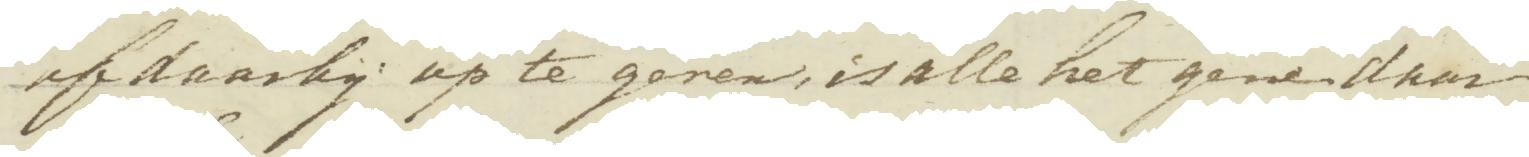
of daarbij op te geven, is alle het genen daar
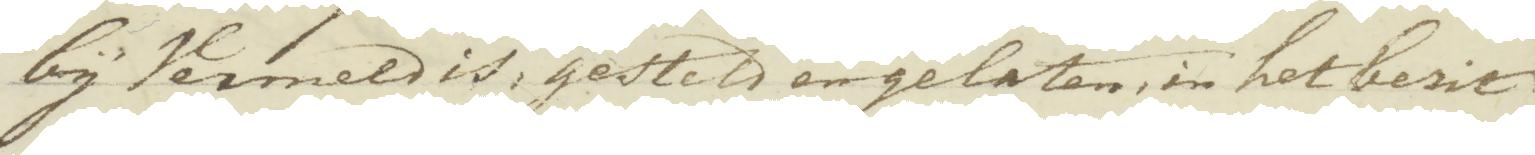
bij Vermeld is: gesteld en gelaten, in het bezit
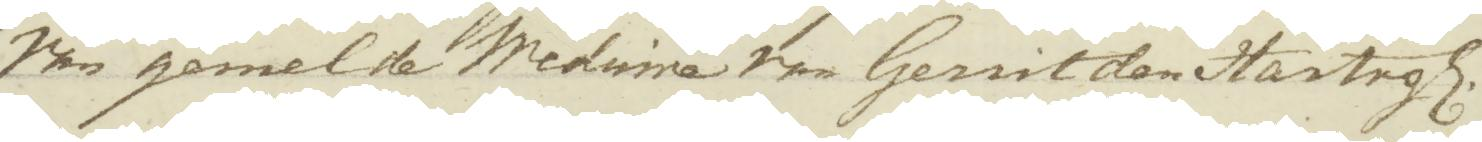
Van gemelde Weduwe van Gerrit den Hartogh,
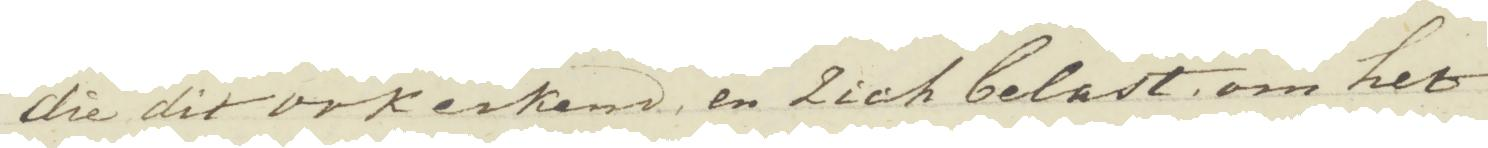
die dit ook erkend, en zich belast, om het
